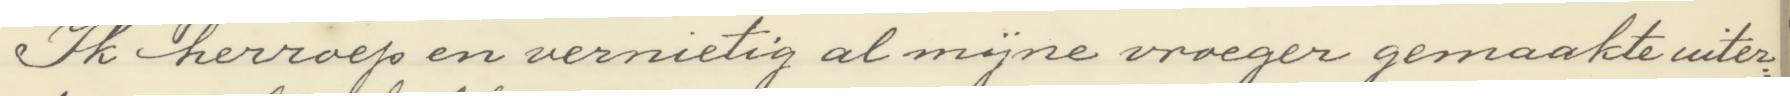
Ik herroep en vernietig al mijne vroeger gemaakte uiter=
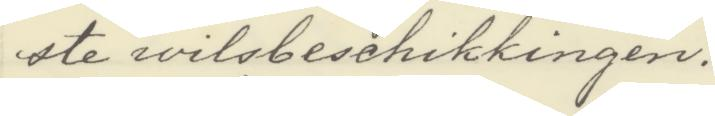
ste wilsbeschikkingen.
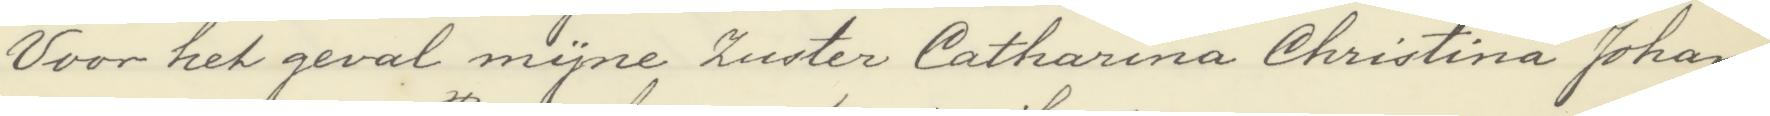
Voor het geval mijne Zuster Catharina Christina Johan=
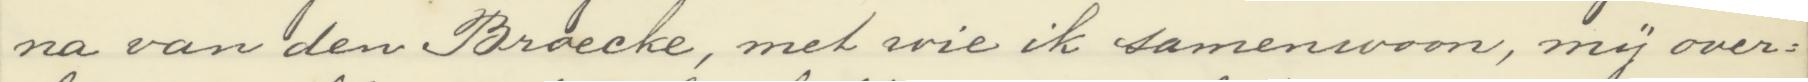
na van den Broecke, met wie ik samenwoon, mij over=
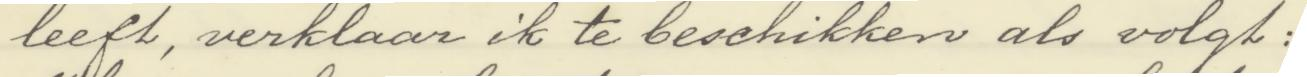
leeft, verklaar ik te beschikken als volgt:
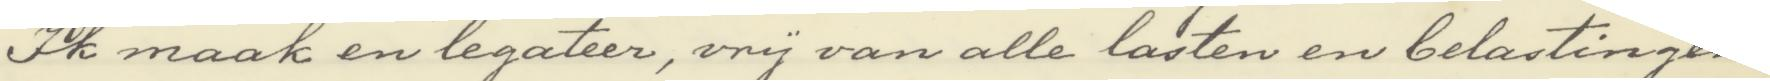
Ik maak en legateer, vrij van alle lasten en belastingen
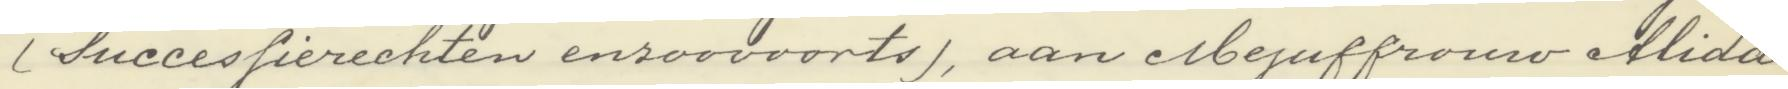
( successierechten en zoovoorts ), aan Mejuffrouw Alida
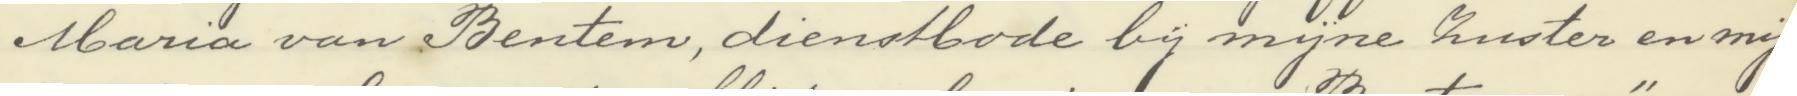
Maria van Bentem, dienstbode bij mijne zuster en mij,
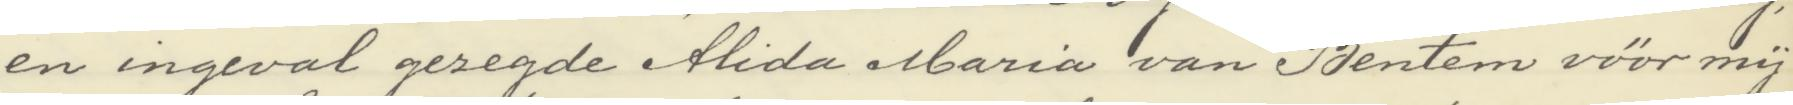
en ingeval gezegde Alida Maria van Bentem vóór mij
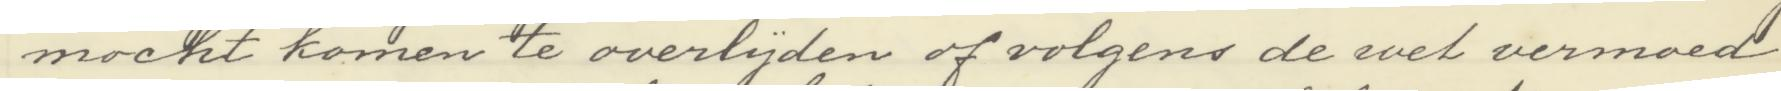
mocht komen te overlijden of volgens de wet vermoed
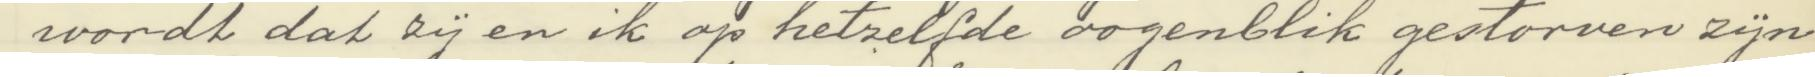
wordt dat zij en ik op hetzelfde oogenblik gestorven zijn
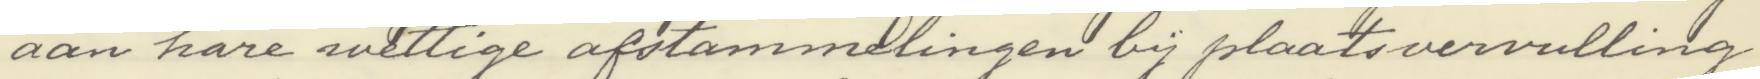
aan hare wettige afstammelingen bij plaats vervulling
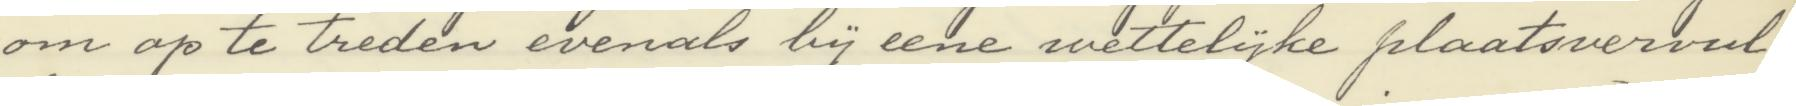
om op te treden evenals bij eene wettelijke plaatsvervul=
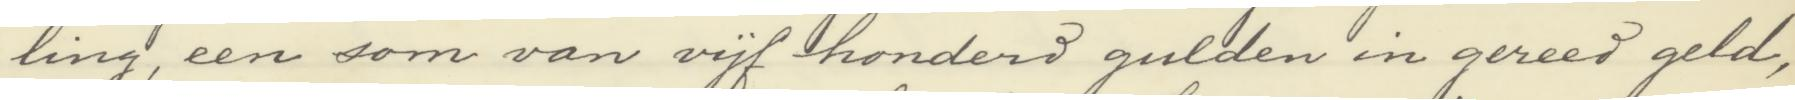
ling, een som van vijf honderd gulden in gereed geld,
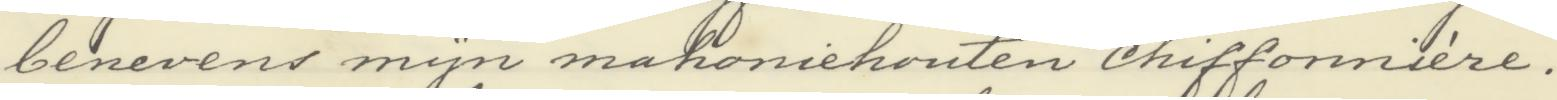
benevens mijn mahoniehouten chiffonnière.
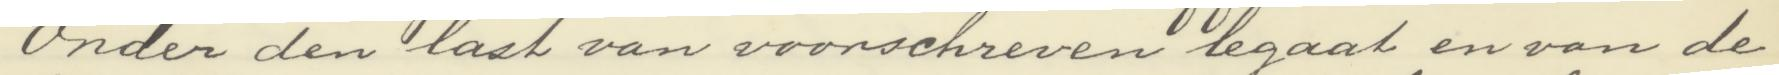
Onder den last van voorschreven legaat en van de
